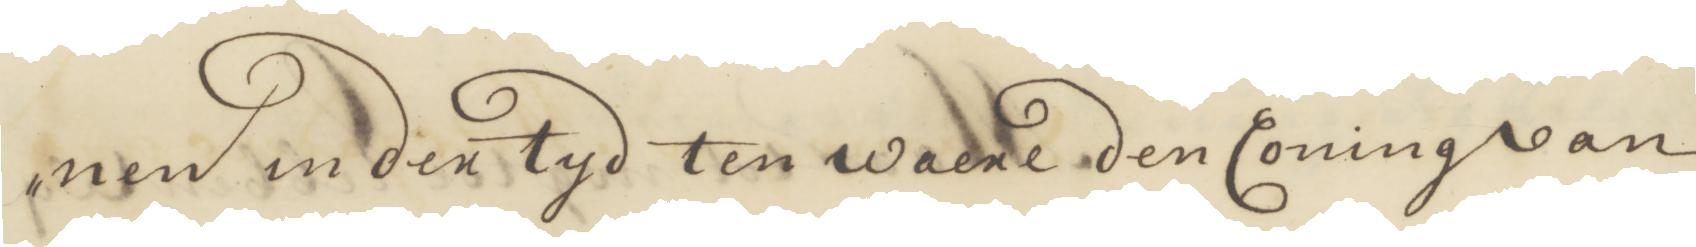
nen in der tyd ten waere den Coning van
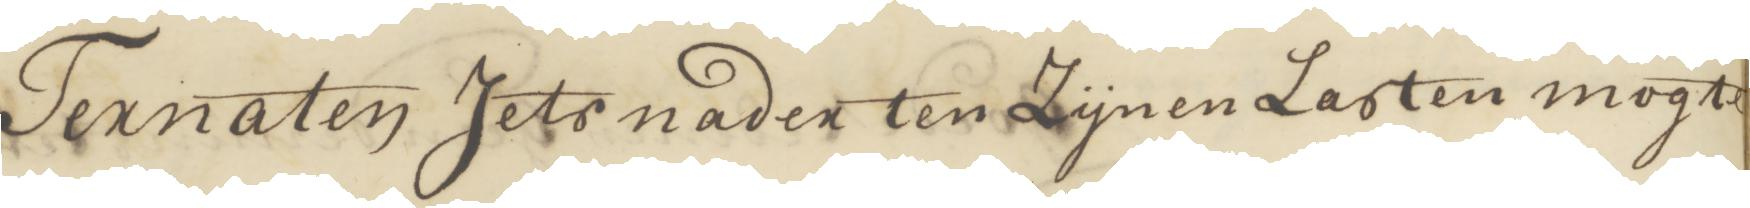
Ternaten Jets nader ten Zijnen Lasten mogte
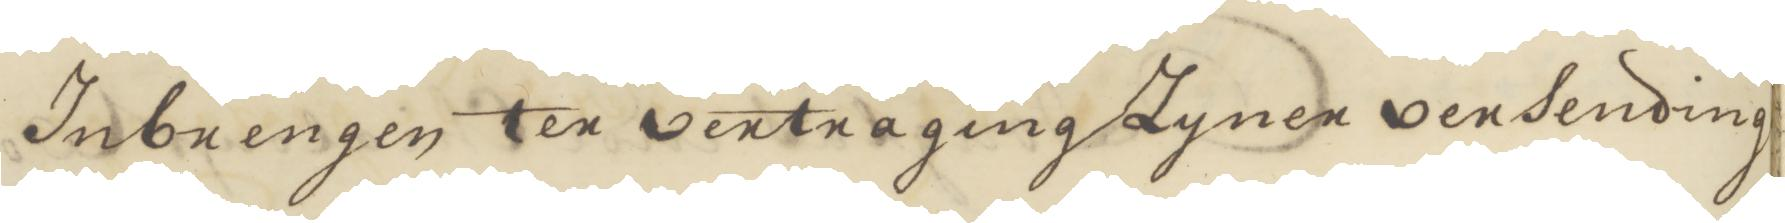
Inbrengen ter vertraging Zijner versending
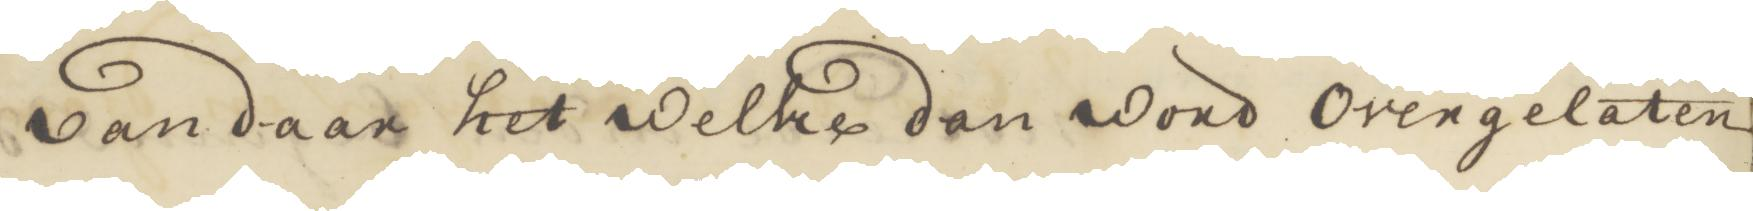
van daar het welke dan word overgelaten
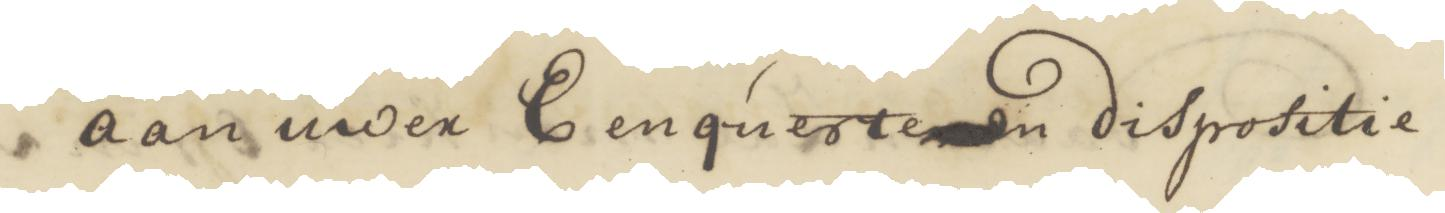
aan uwer Eenquesteren dispositie
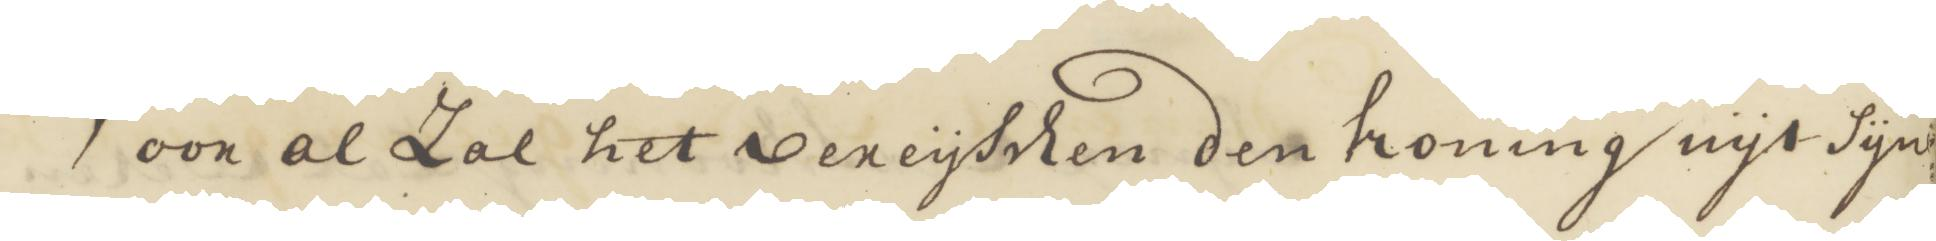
Voor al Zal het vereijschen den koning uijt sijn
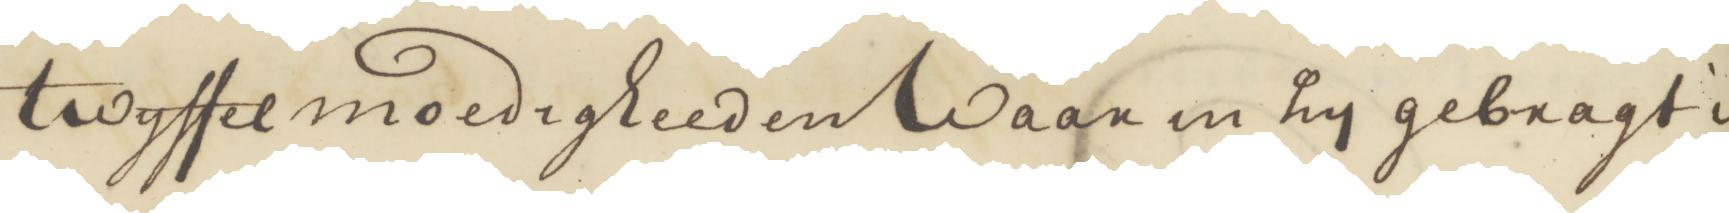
twyffel moedigheeden Waar in hy gebragt i
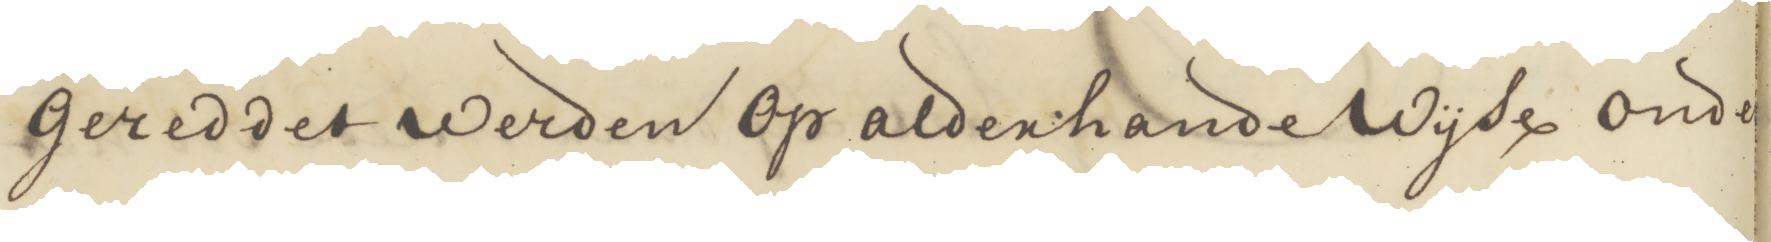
gereddet werden op alderhande wijse onde
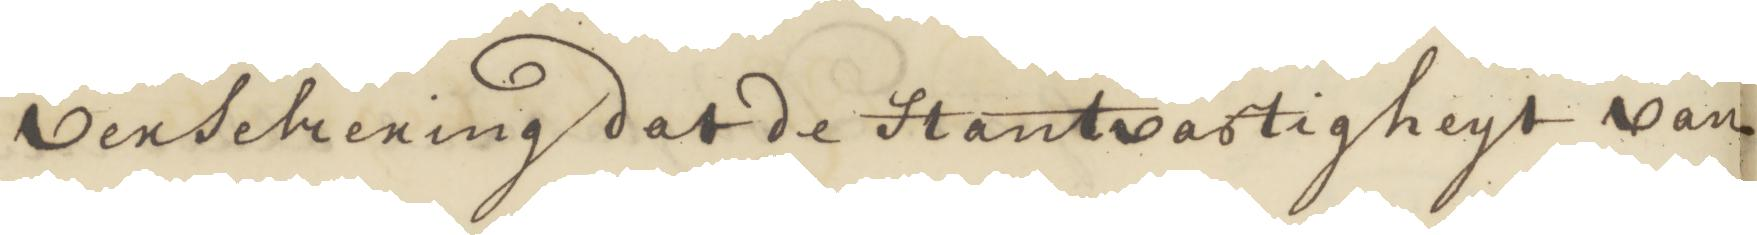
versekering dat de stantvastigheyt van
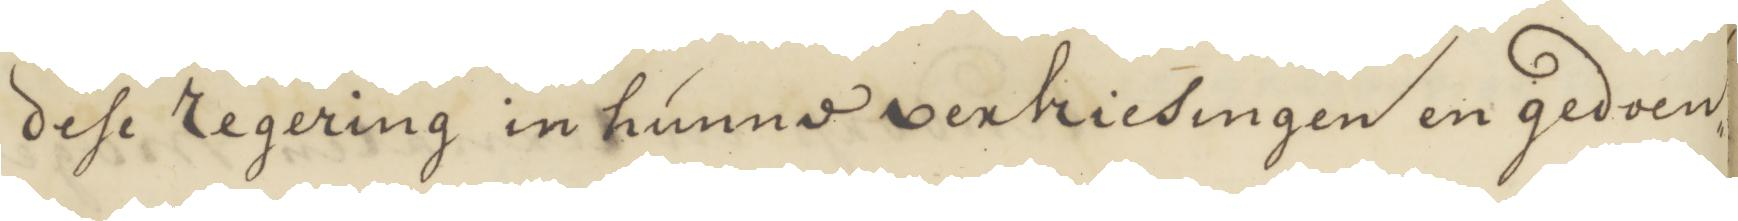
dese regering in hunne verkiesingen en gedoen„
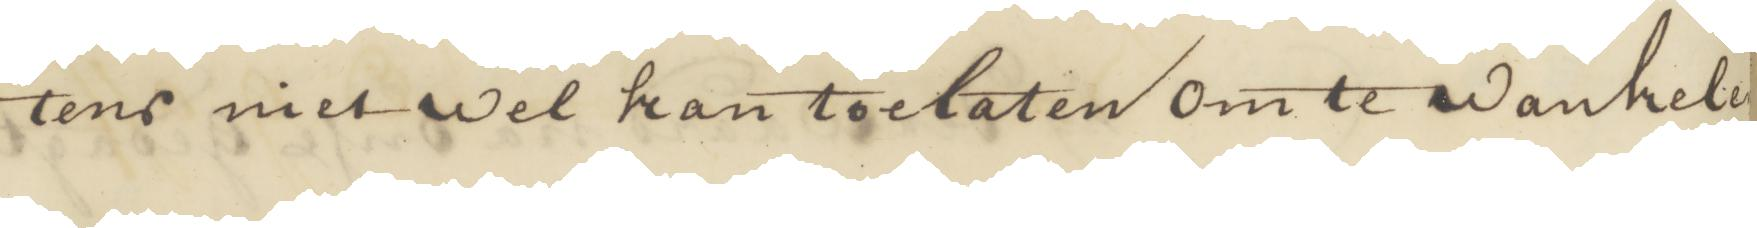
tens niet wel kan toelaten om te wankele
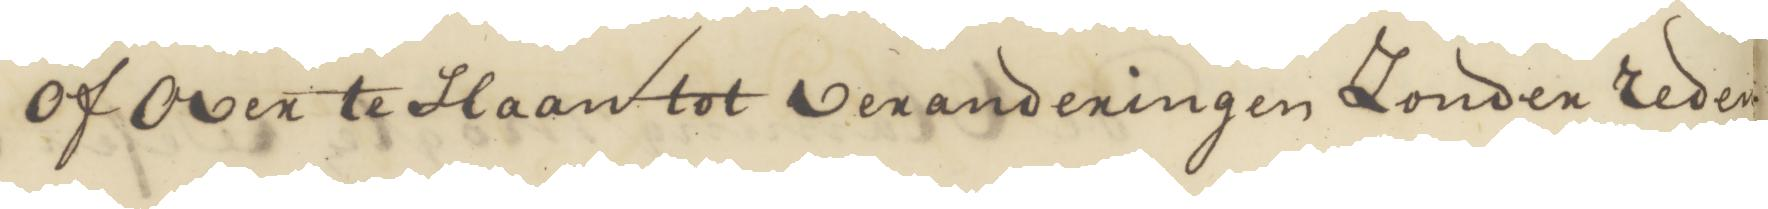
of over te slaan tot veranderingen Zonder reden
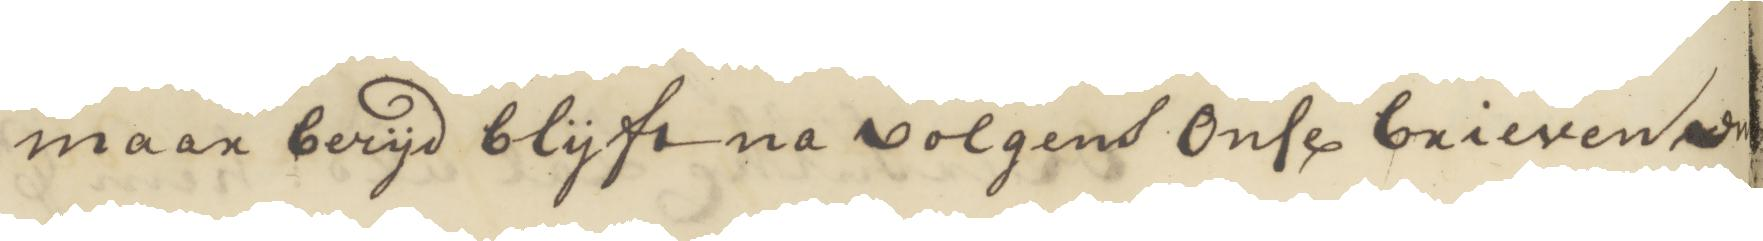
maar berijd blijft na volgens onse brieven en
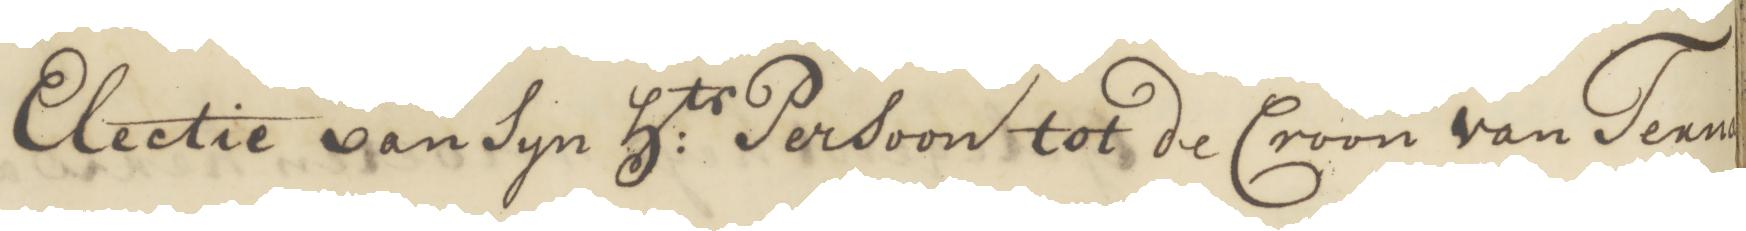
Electie van Sijn H:ts Persoon tot de Croon van Terna
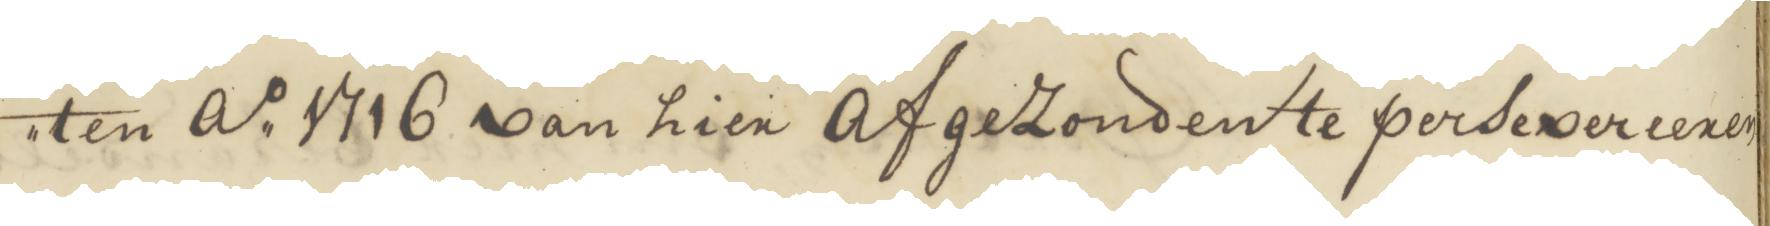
„ten A„o 1716 van hier afgezonden te persevereeren
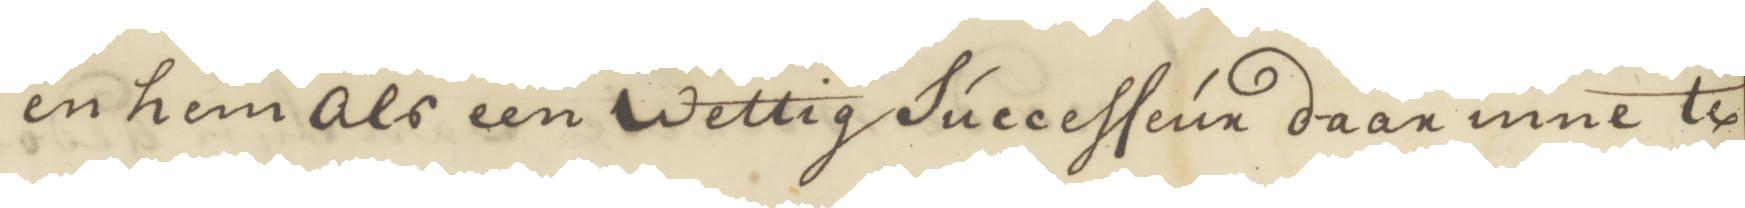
en hem als een wettig Successeur daar inne te
